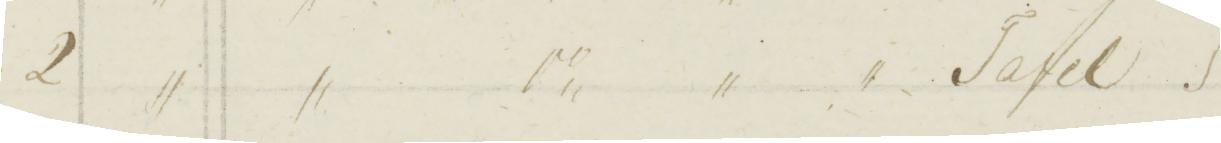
2 „ „ d„o „ „ Tafel
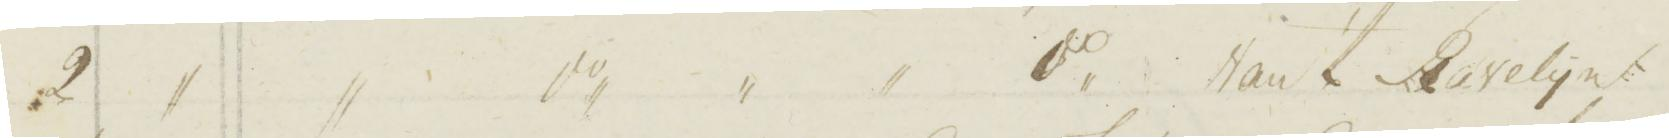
2 „ „ d„o „ „ d„o Van ’t Ravelijn
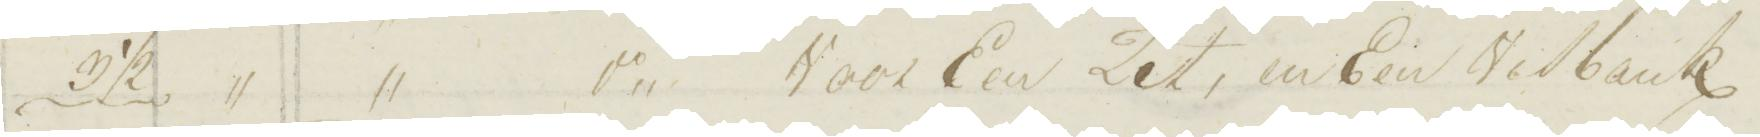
3½ „ „ d„o Voor Een Zit, en Een Visbank
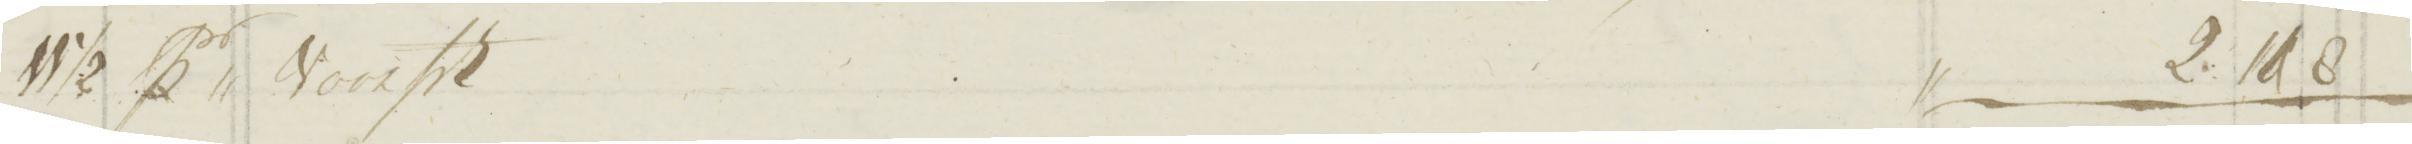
11½ p„s Voorz „ 2: 14 8
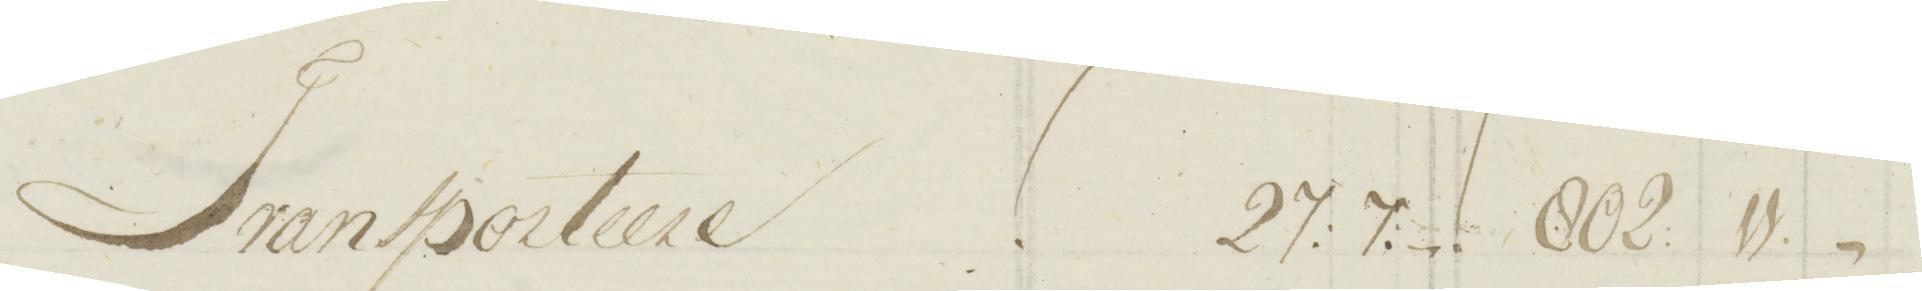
Transporteere ƒ 27: 7: — ƒ 802: 11. —
